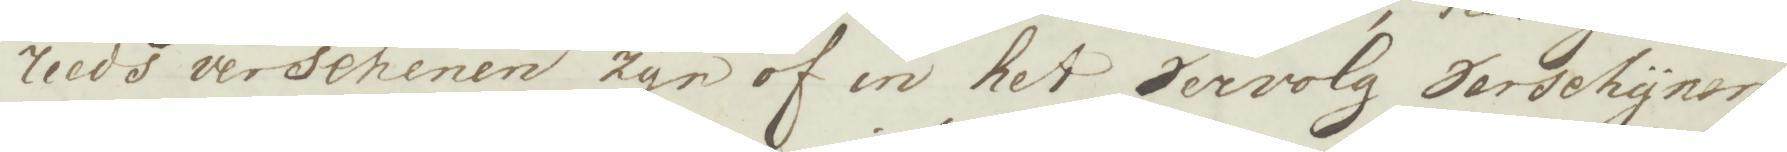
reeds verschenen zijn of in het vervolg verschijnen
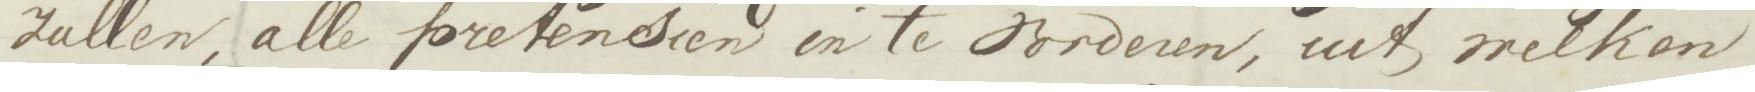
zullen,┘ alle pretensien en te vorderen, uit welken
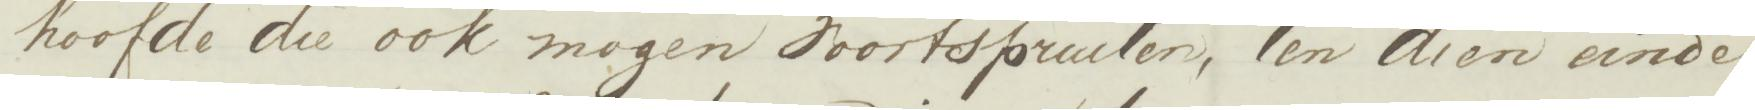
hoofde die ook mogen voortspruiten, ten dien einde
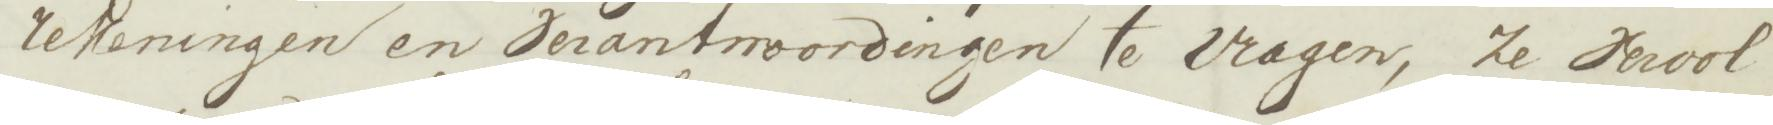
rekeningen en verantwoordingen te vragen, ze vervol
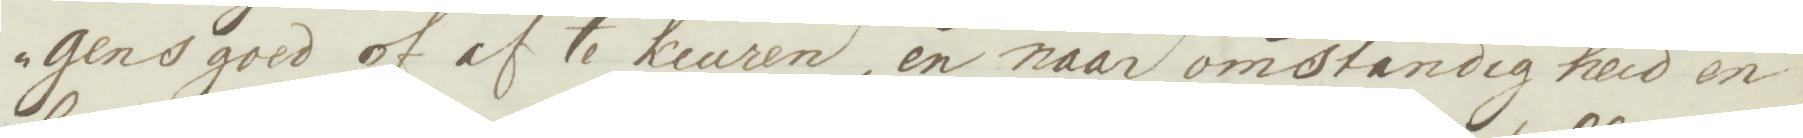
„gens goed of af te keuren, en naar omstandig heid en
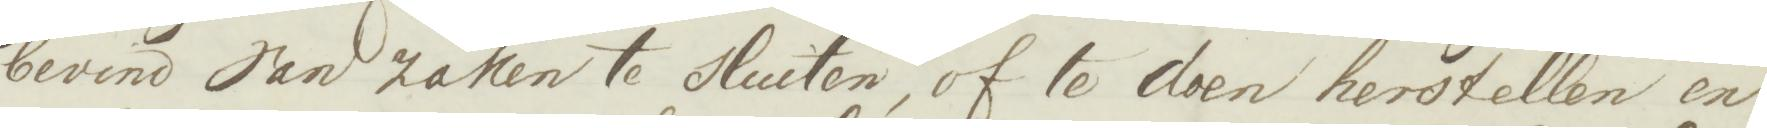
bevind van zaken te sluiten, of te doen herstellen en
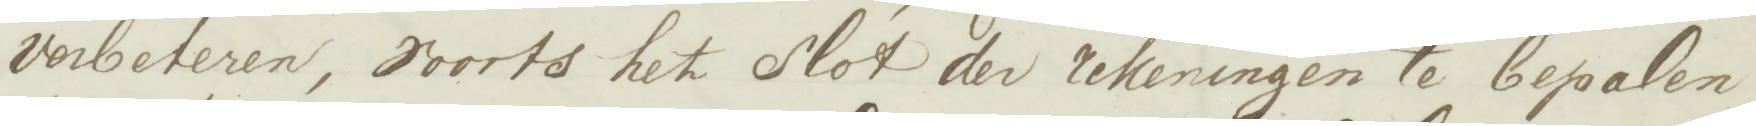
verbeteren, voorts het slot der rekeningen te bepalen
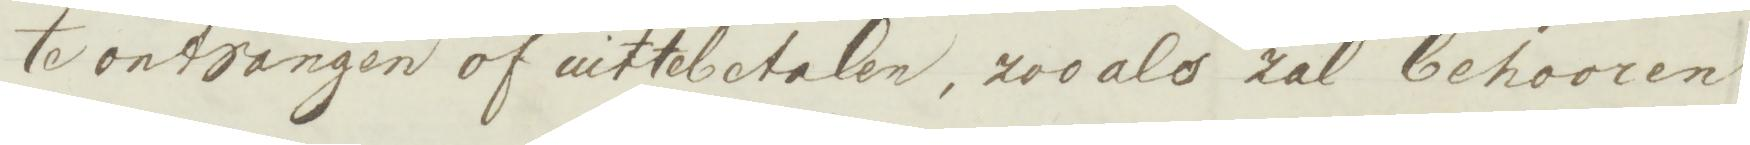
te ontvangen of uittebetalen, zoo als zal behooren┘
